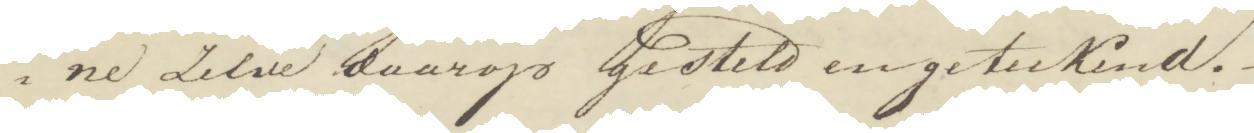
„ne zelve daarop gesteld en geteekend. —
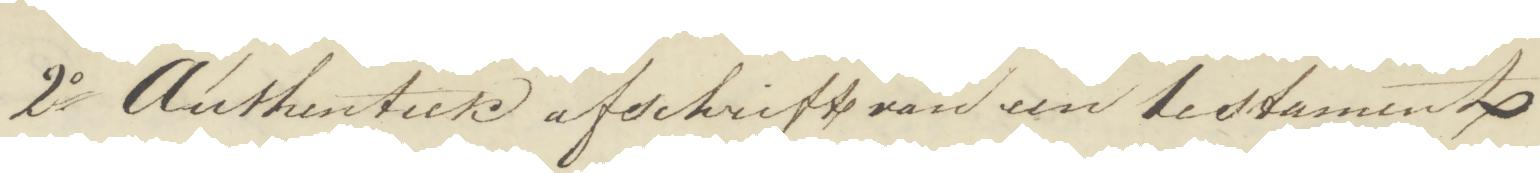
2=o„ Authentiek afschrift van een testament
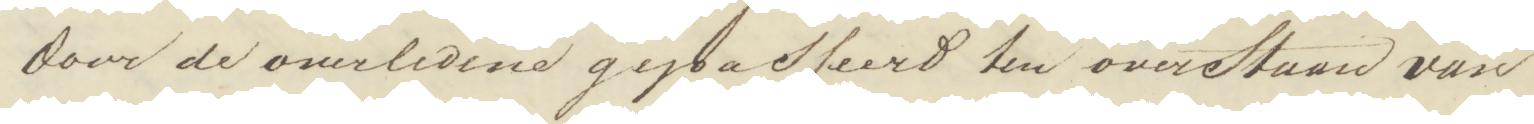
door de overledene gepasseerd ten overstaan van
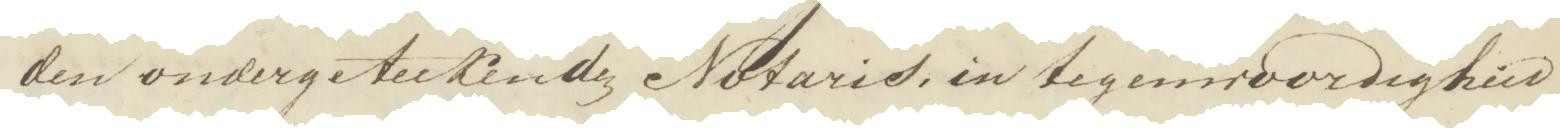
den ondergeteekenden Notaris, in tegenwoordigheid
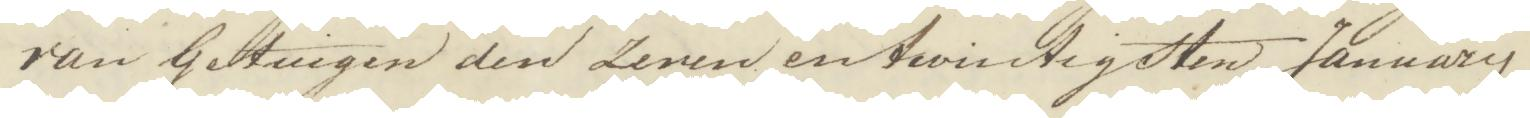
van Getuigen den zeven en twintigsten January
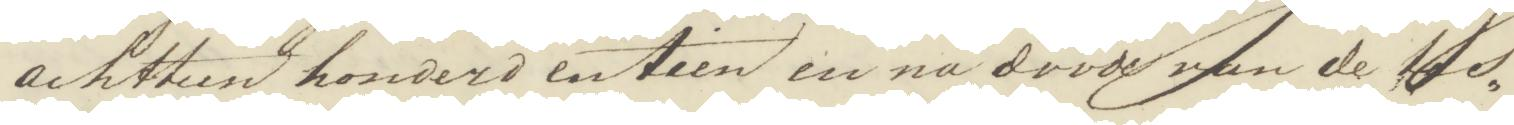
achttien honderd en tien en na doode van de tes„
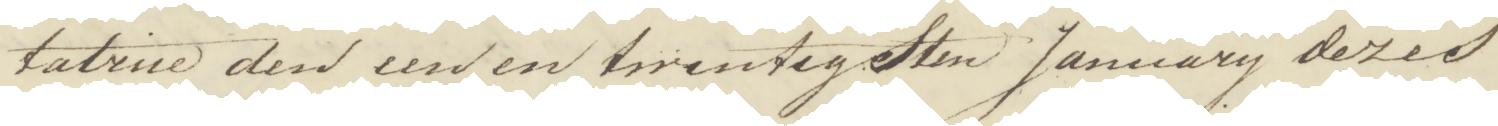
tatrice den een en twintigsten January dezes
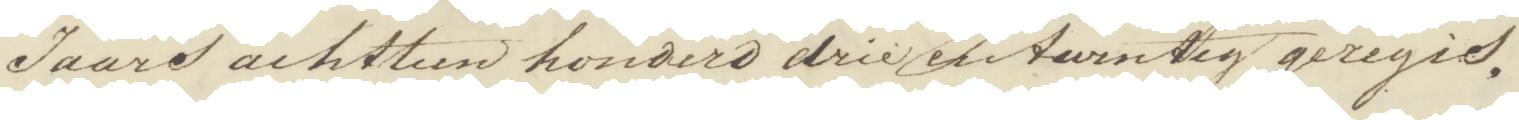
Iaars achttien honderd drie en twintig geregis„
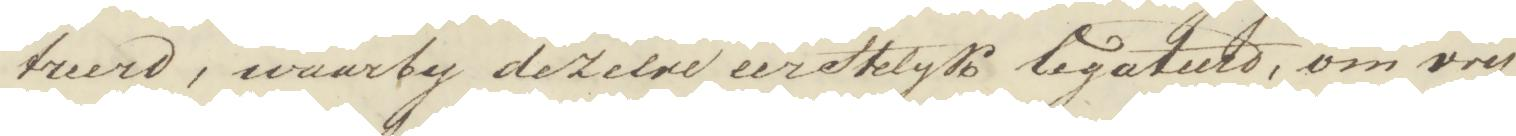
treerd, waarby dezelve eerstelyk legateerd, om vry
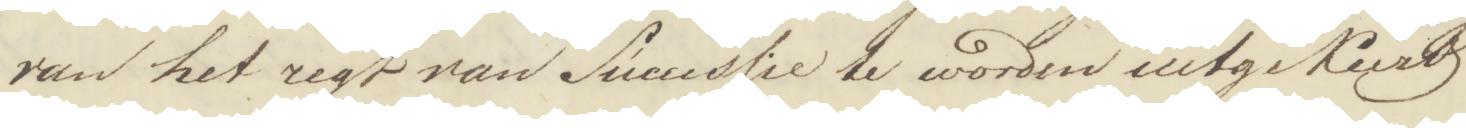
van het regt van successie te worden uitgekeerd,
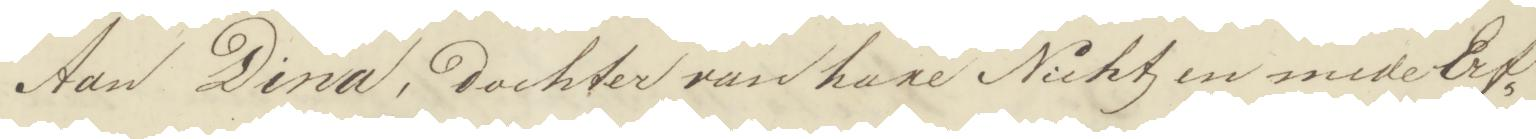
Aan Dina, dochter van hare Nicht en mede Erf„
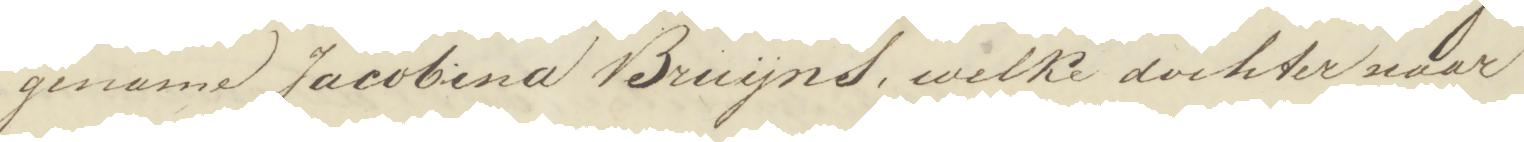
„gename Jacobina Bruijns, welke dochter naar
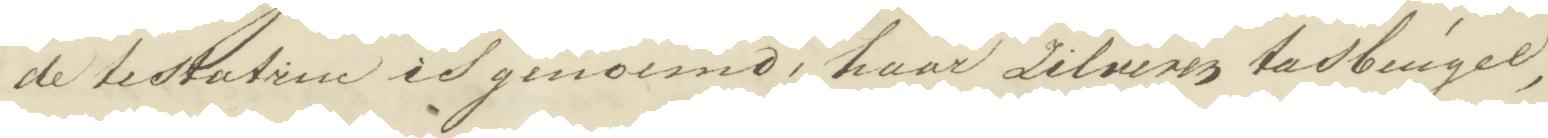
de testatrice is genoemd, haar zilveren tasbeugel,
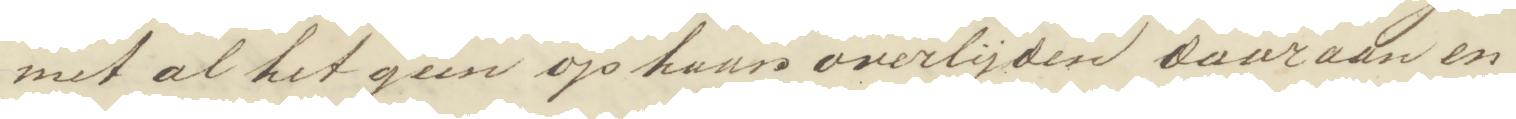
met al het geen op haar overlijden daaraan en
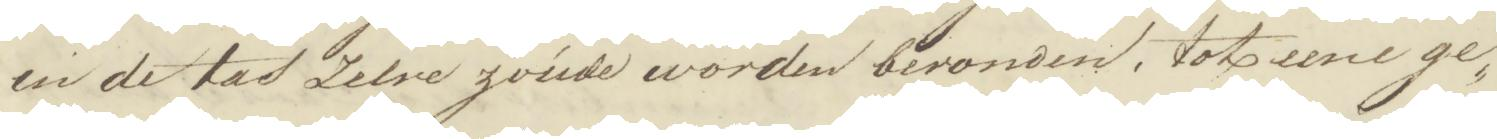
in de tas zelve zoude worden bevonden, tot eene ge„
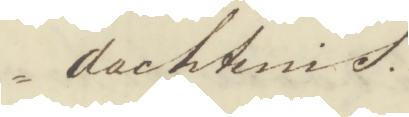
„dachtenis. —
